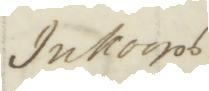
Inkoops
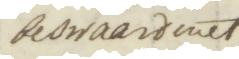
beswaar met
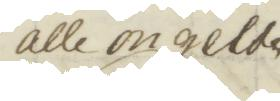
alle ongelden
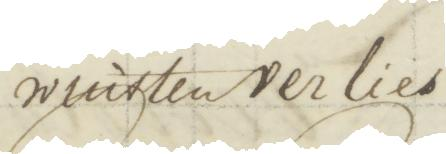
winsten verlies
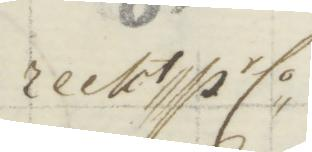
reek„t prc„o
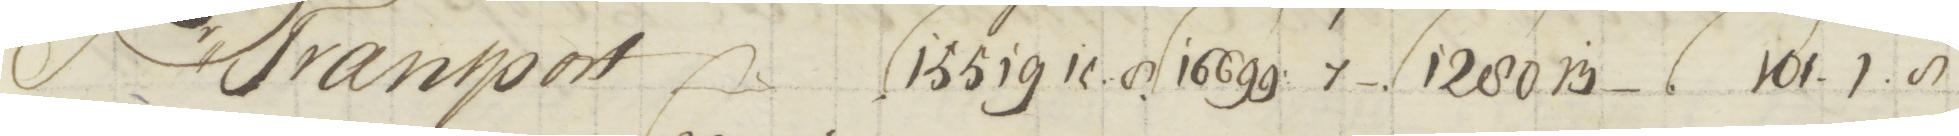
P„r Transport ƒ15519 15:8 ƒ16699: 7— ƒ1280 13— ƒ101. 1. 8
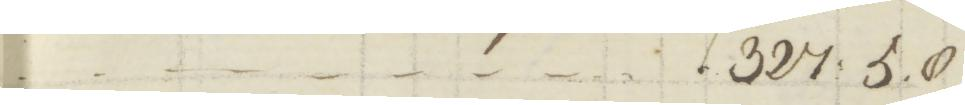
- - - - - - - - - - ƒ327:5.8
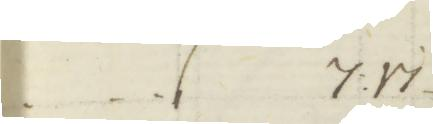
. - -ƒ 7:17.
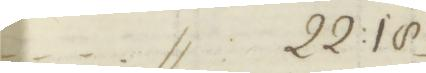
- - .„ 22:18—
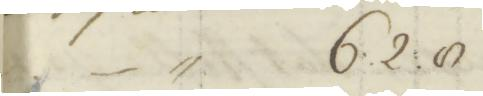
- —„ 6:2:8
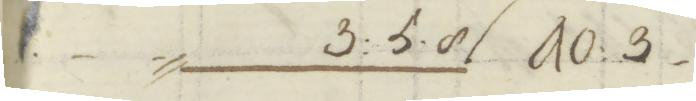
. - -„ 3:5.8 ƒ 40: 3 -
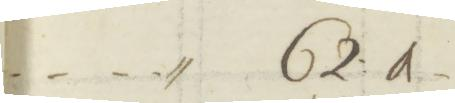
- - - -„ 62: 4-
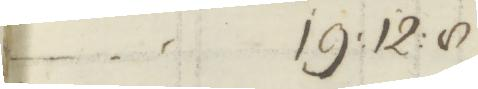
- - - , 19: 12: 8
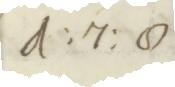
ƒ 4: 7: 8
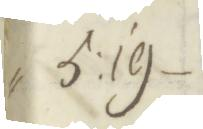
„ 5:19—
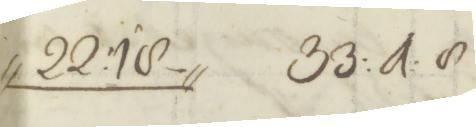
„ 22:18—„ 33: 4: 8
